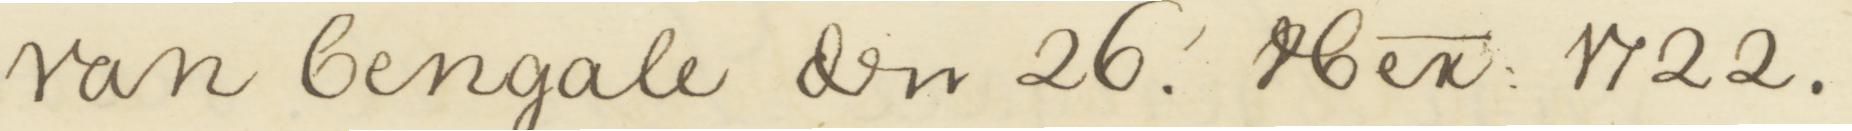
van bengale den 26.' 8ber: 1722.
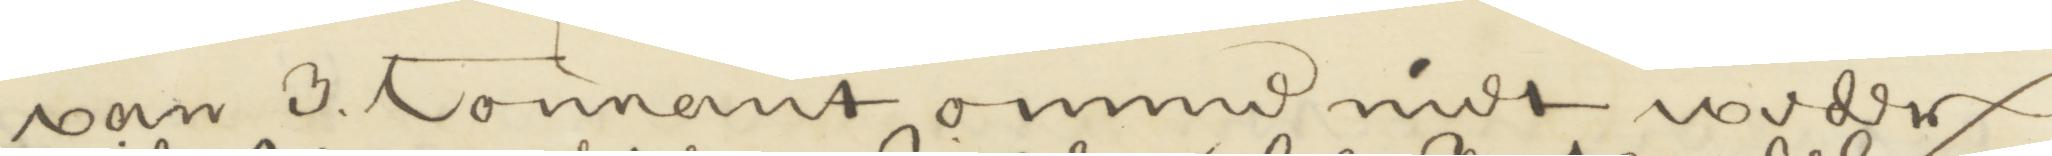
van 3. Courant omme niet weder
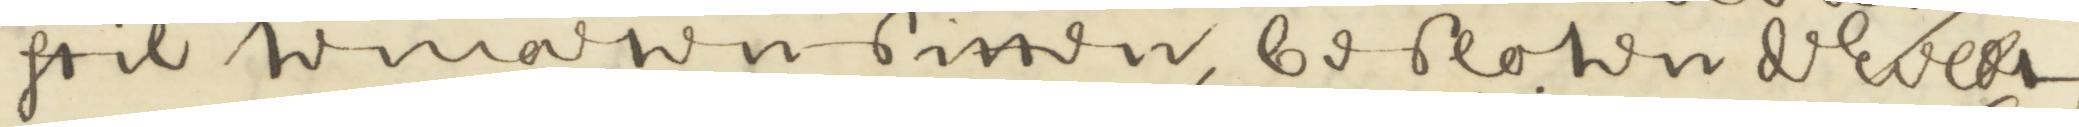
stil te moeten sitten, besloten de helft
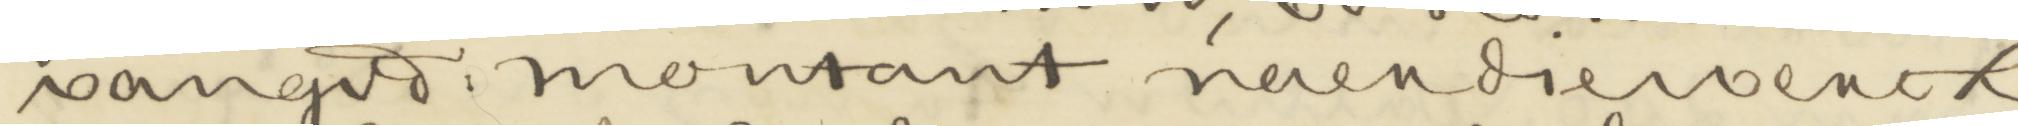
van ged: montant naer die werck
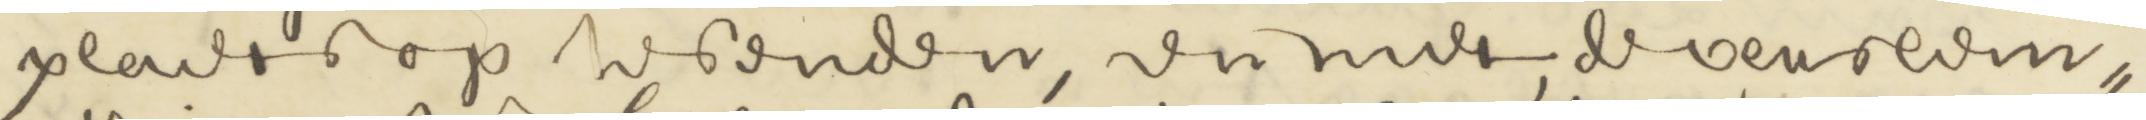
plaets op tesenden en met de verstem„
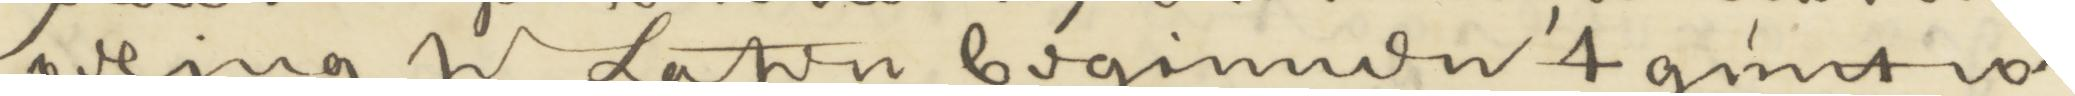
peling te laten beginnen 't gunt w'
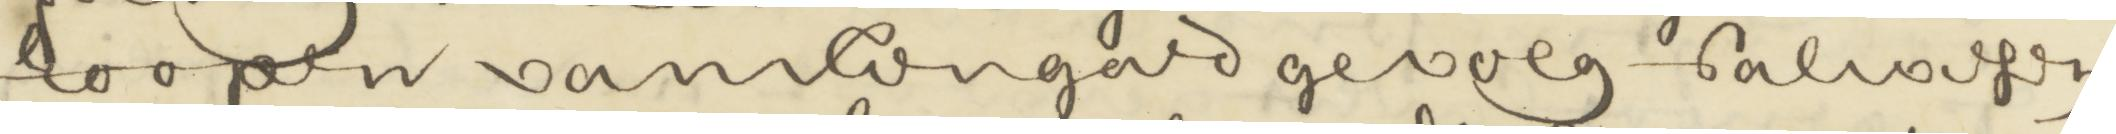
hoopen van Een goed gevolg salwesen
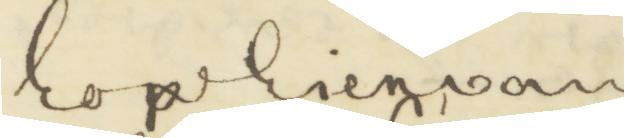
hope hier van
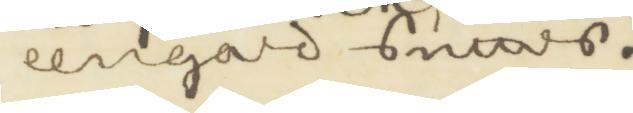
een goed succes.
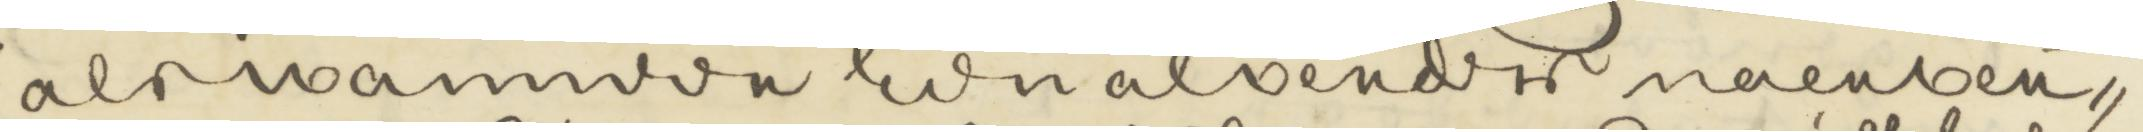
als wanneer hen alverders naer ver„
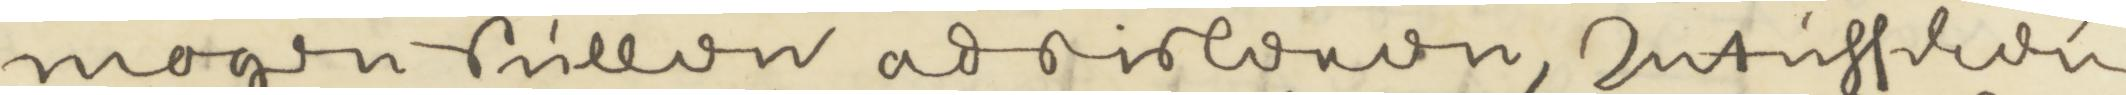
mogen sullen adsisteren, jntusschen
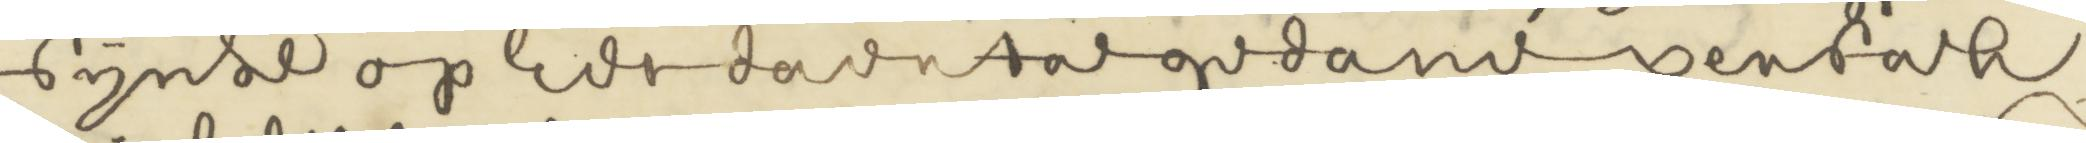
sijnde op het daer toe gedane versoek
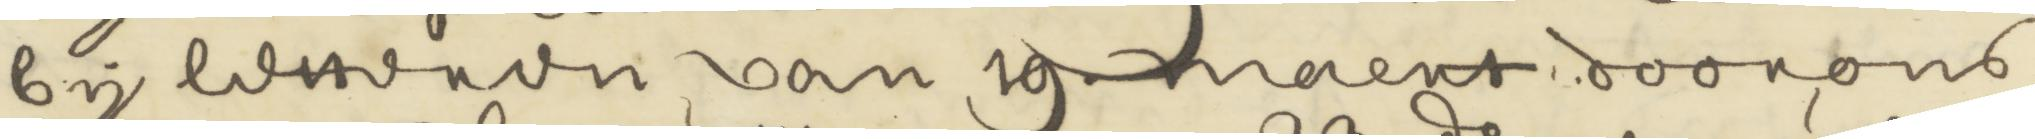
bij letteren van 19. maert door ons
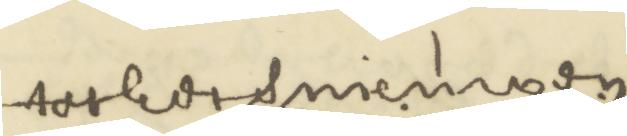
tot het vernieuwen
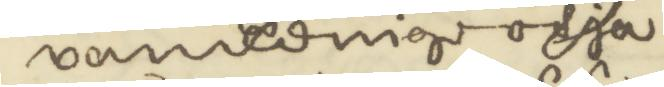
van Eenige overja
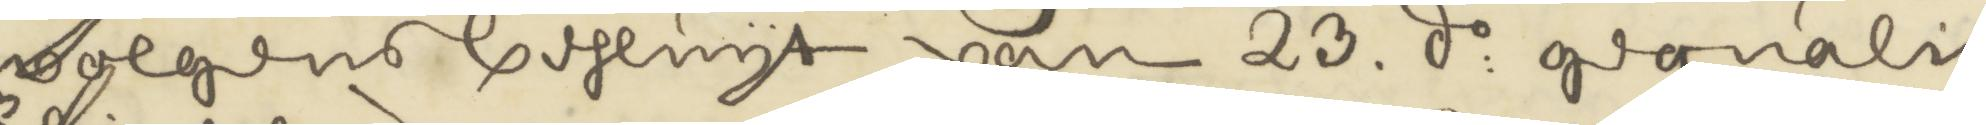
volgens besluijt van 23. d:o gequali
